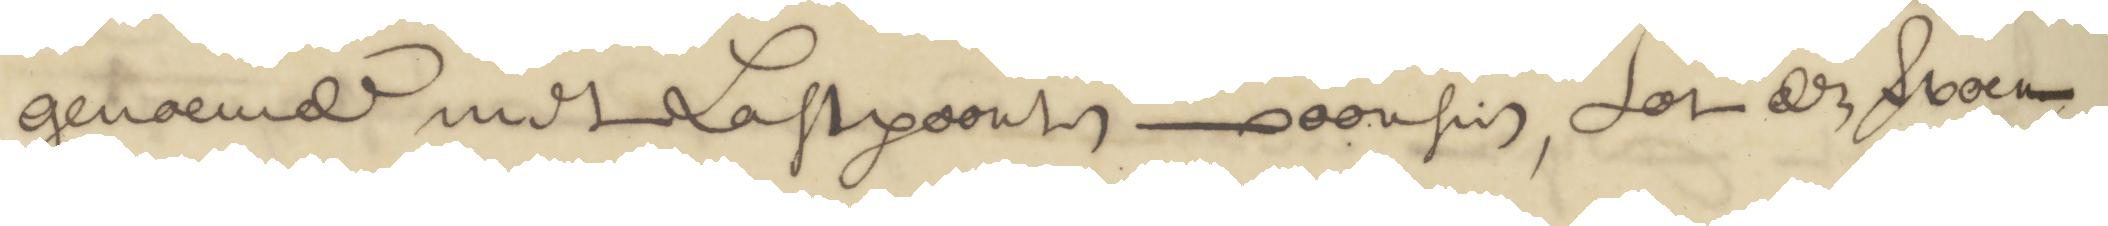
genoemde met lastpoorten voorsien, tot den vervoer
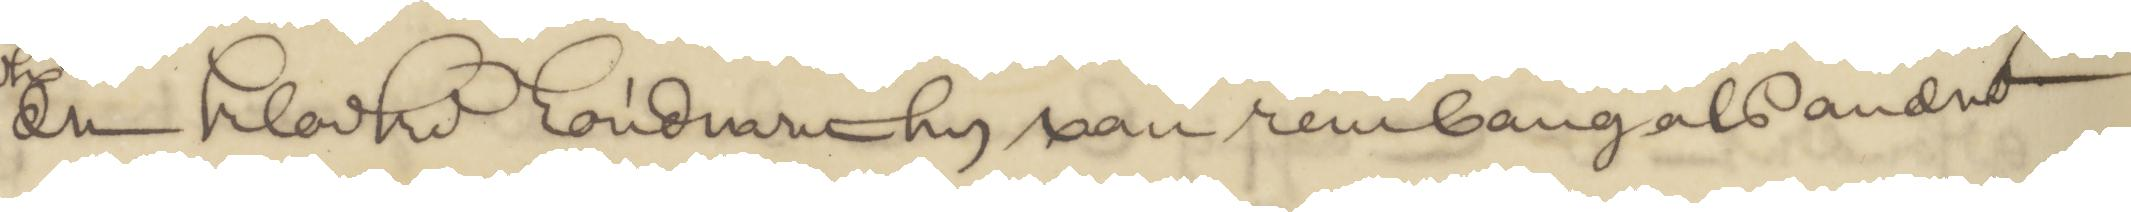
der kloeke houdwercken van rembang als andre
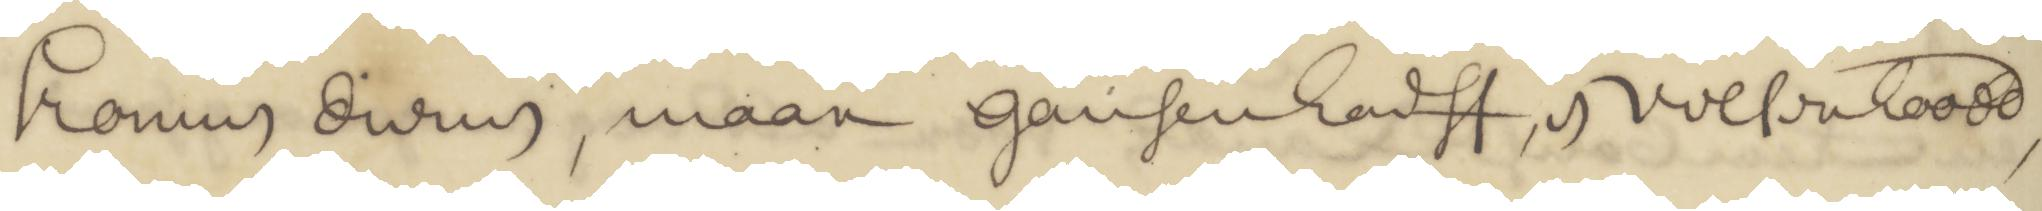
konnen dienen, maar gansenhoeff, en velserhoofd,
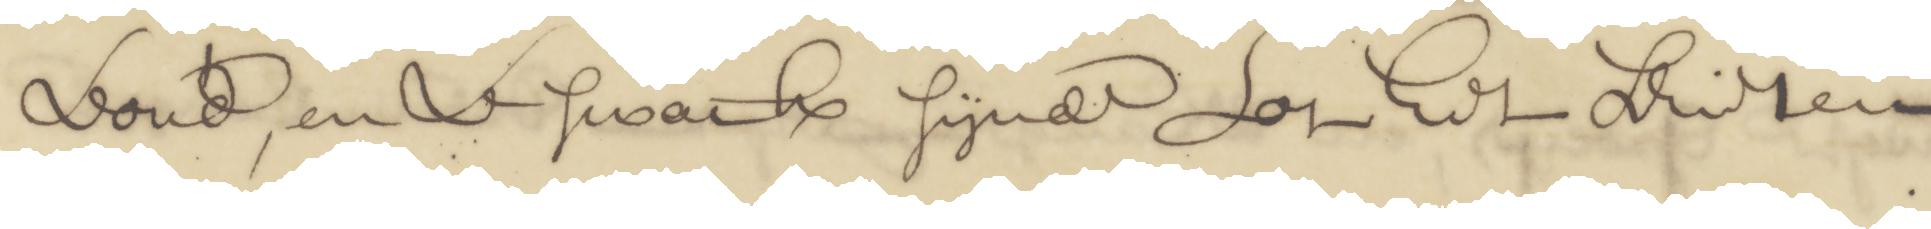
te oud, en te swack sijnde tot het schieten
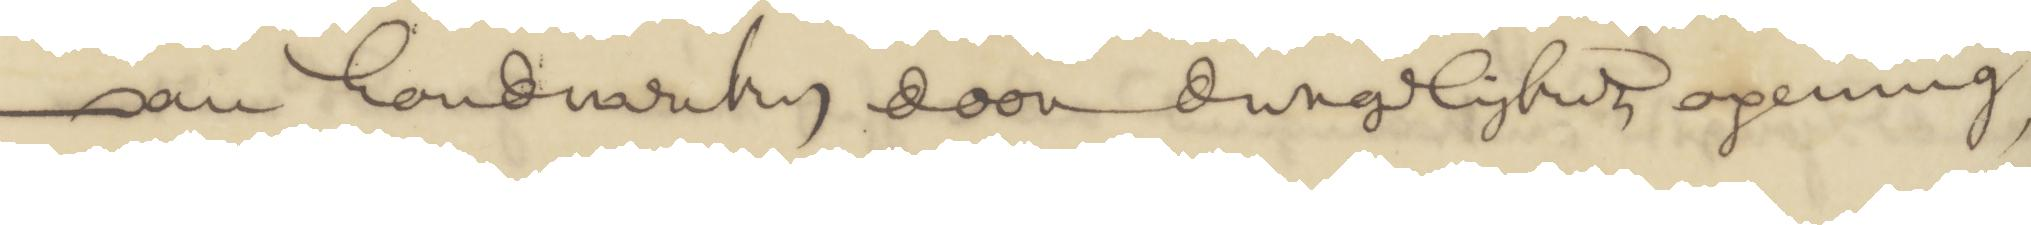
van houdwerken door durgelijken opening,
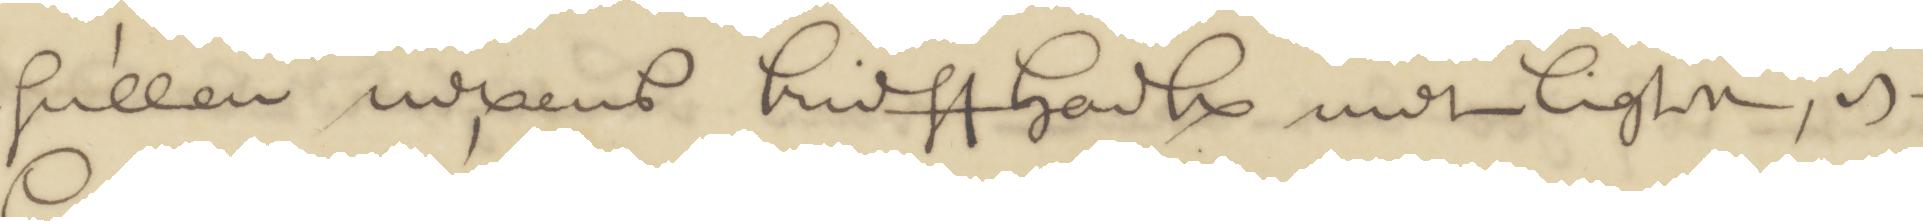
sullen nevens kieffhoek met ligter, en
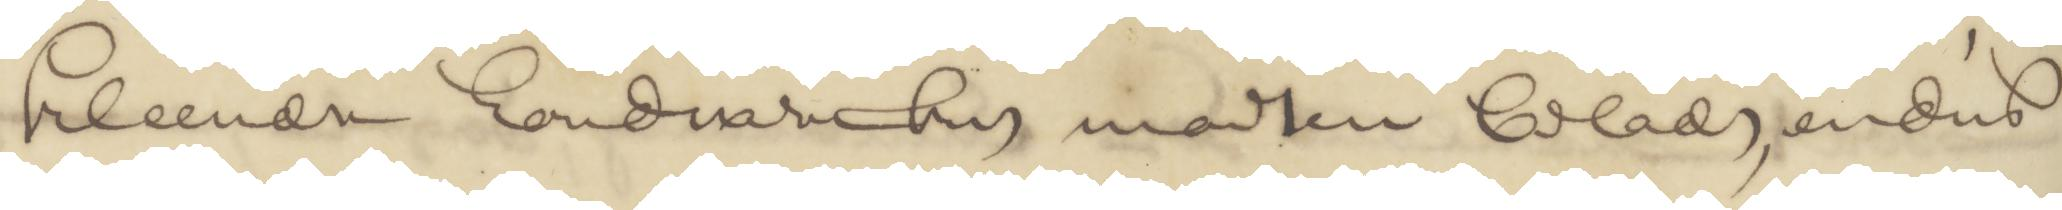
kleender houdwercken moeten beladen, en dus
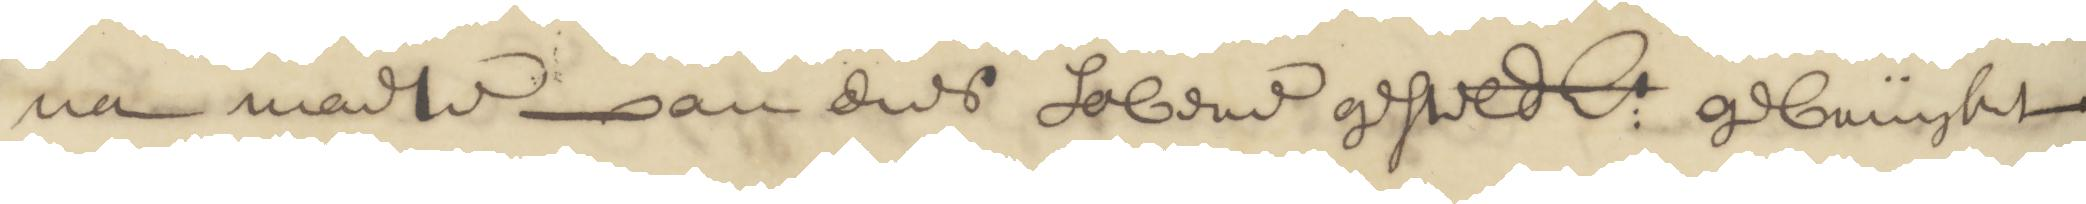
na maete van dies sobere gesteldh:t gebruijkt
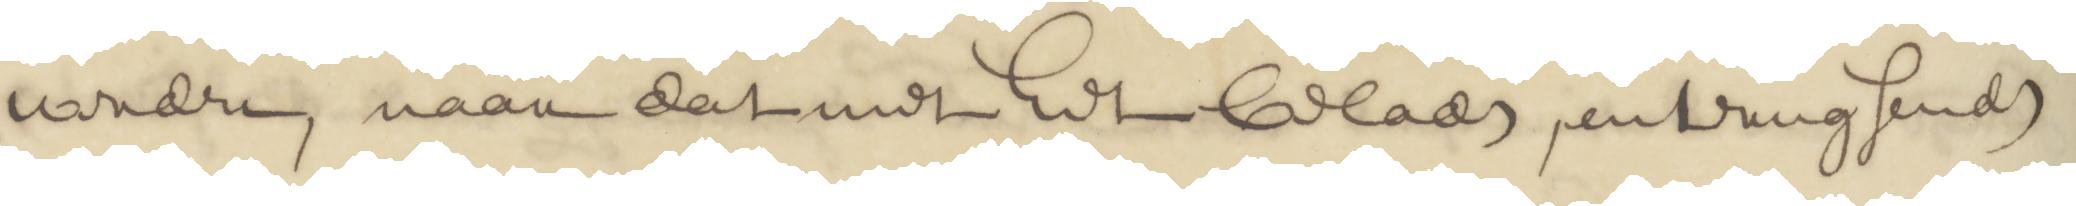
werden, naar dat met het beladen, en terugsenden
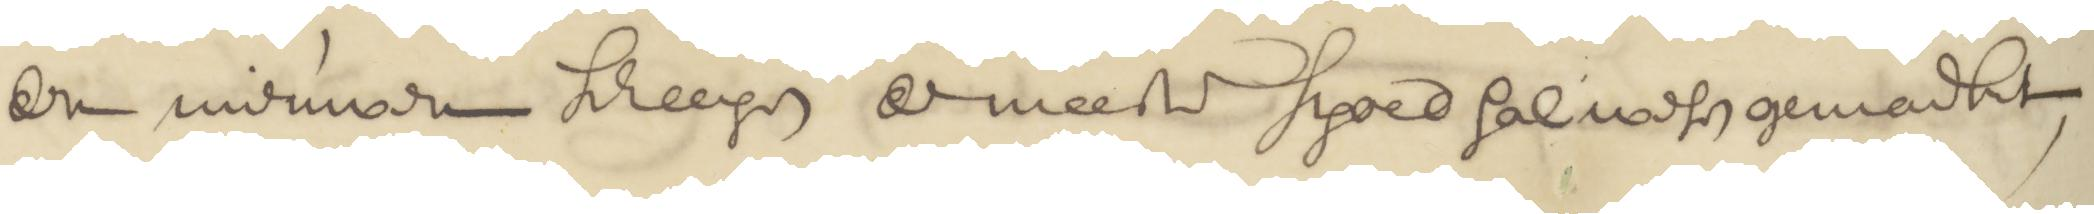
den nieuwen scheepen de meeste spoed sal wesen gemaekt,
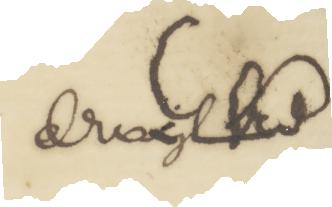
dewijl ke
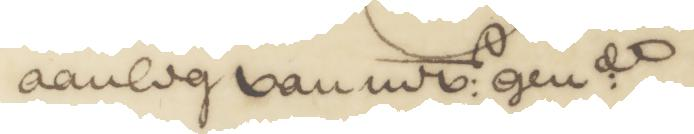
aanleg van nev:s gen:de
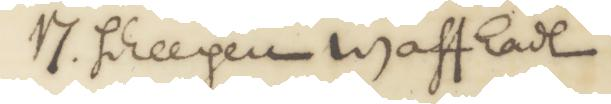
17. scheepen ten affhael
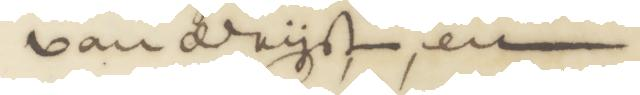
van de rijst, en
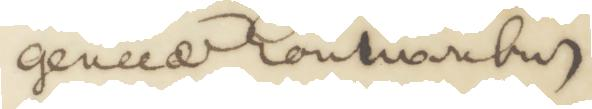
gereede houtwerken
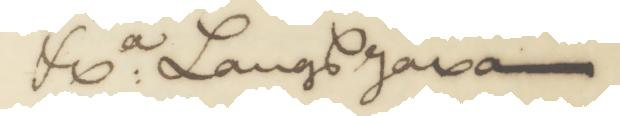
&:a Langs Java
